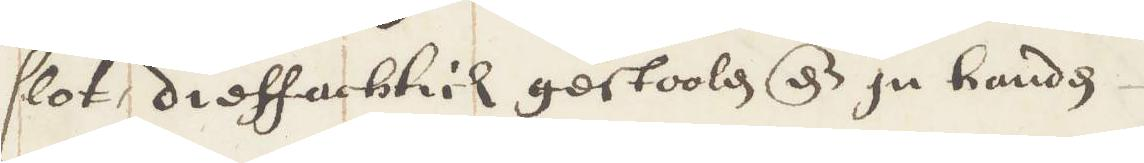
slot, dieffachtich gestoolen ende jn handen
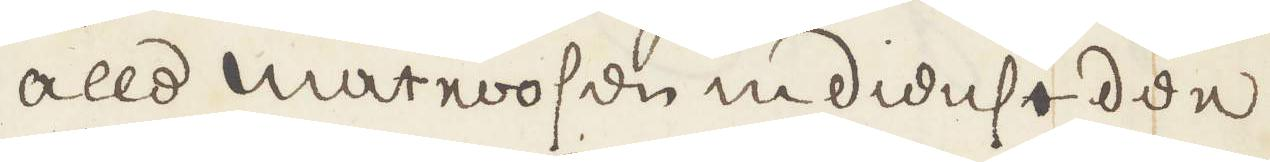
alle matroosen in dienst der
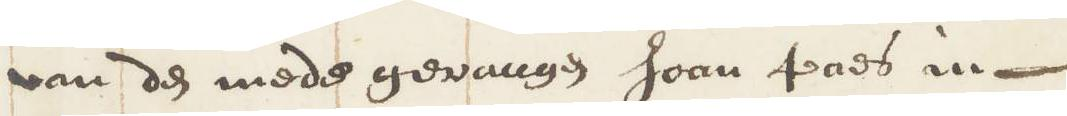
van den mede gevangen Joan paes in—
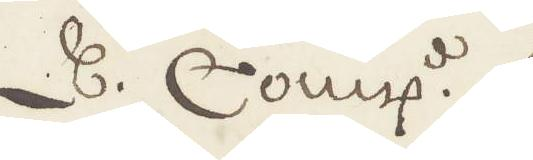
E. Comp:e
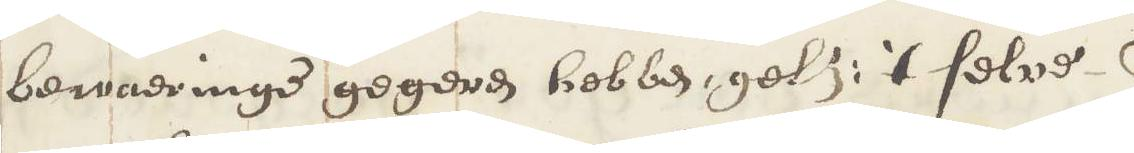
bewaeringe gegeven hebben, gelijk ’t selve
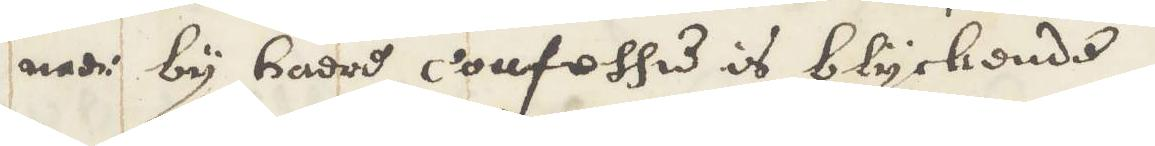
naer bij haere confessie is blijckende
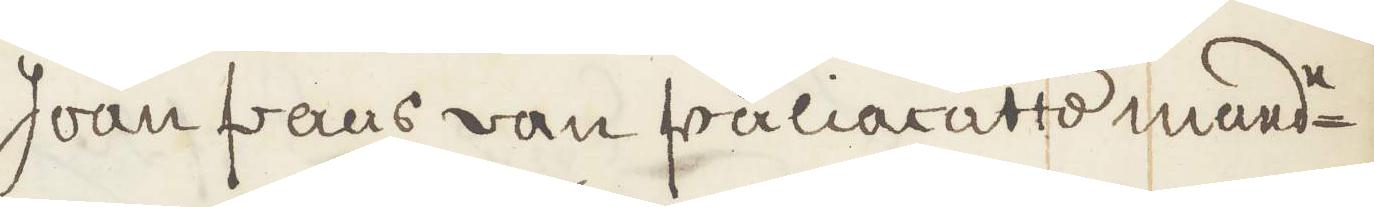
Joan paas van paliacatte mard=r
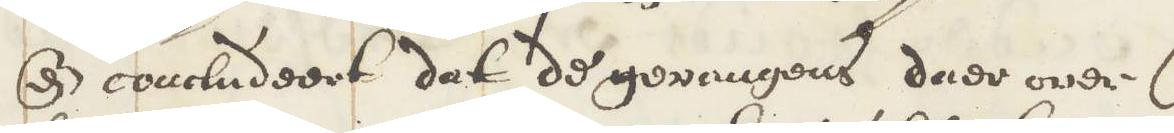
ende concludeert dat de gevangens daer over-
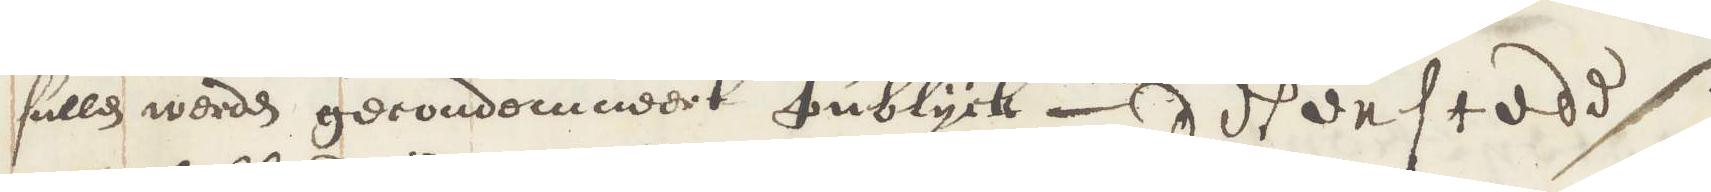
sullen werden gecondemneert publijck — deser stede/
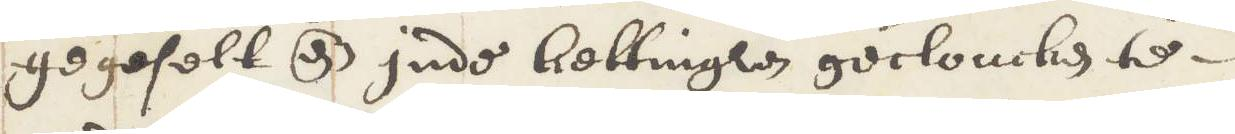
gegeselt en jnde kettinghen gecloncken te -
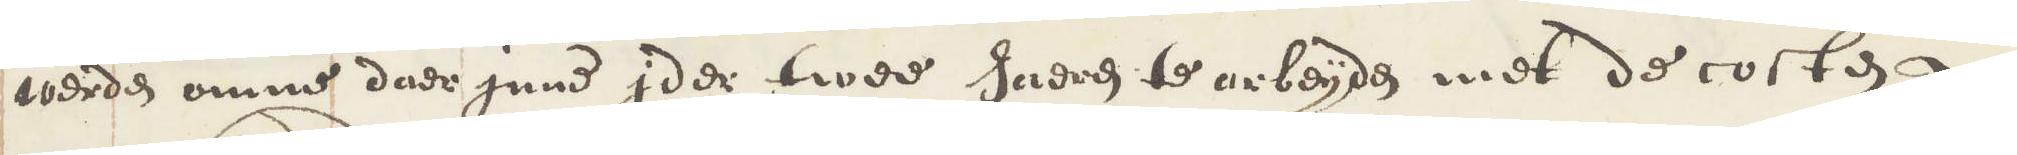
werden omne daer jnne jder twee Jaeren te arbeijden met de costen —
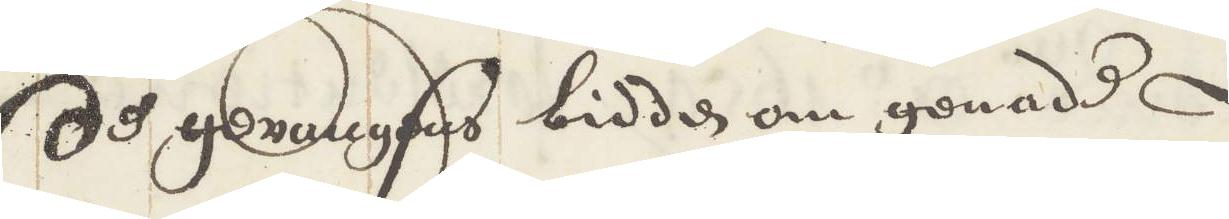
de gevangens bidden om genade
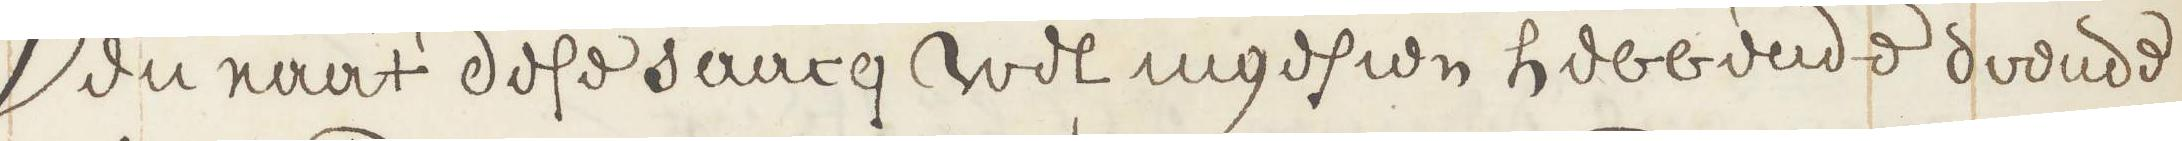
Den raat dese saacq wel ingesien hebbende doende
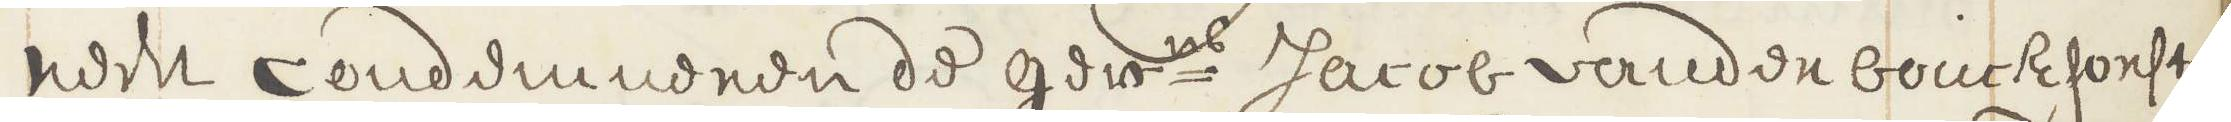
recht condemneren de gev=ns Jacob vander bouckhorst
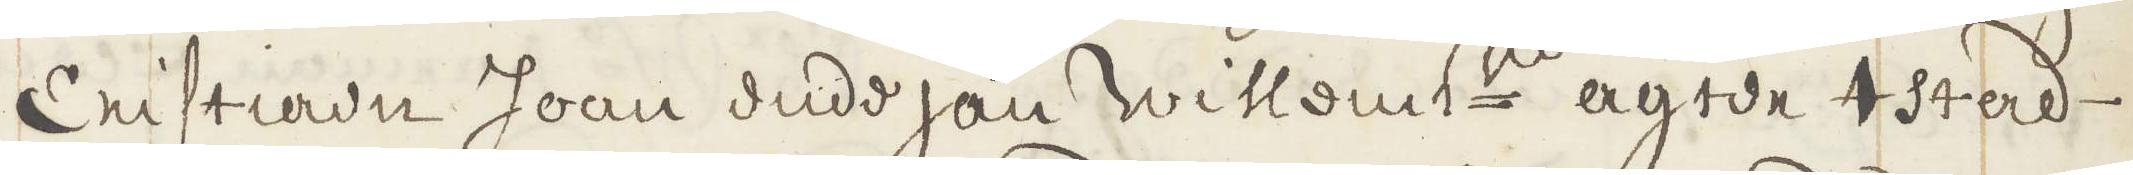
Cristiaen Joan ende Jan willemsz agter t stad-
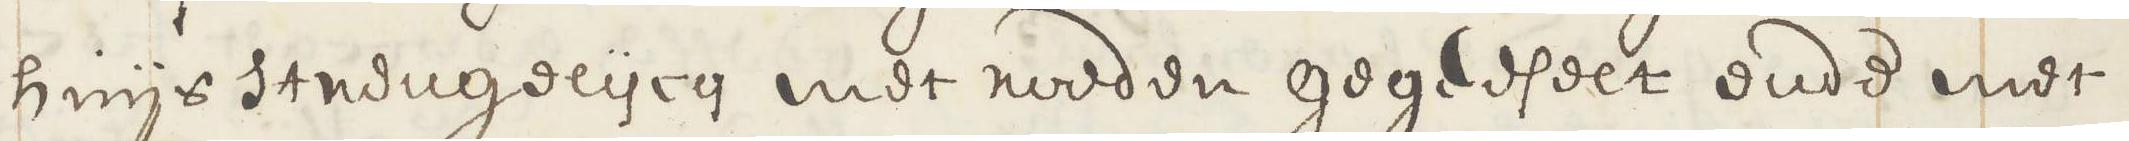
huijs strengelijcq met roeden gegeeselt ende met
